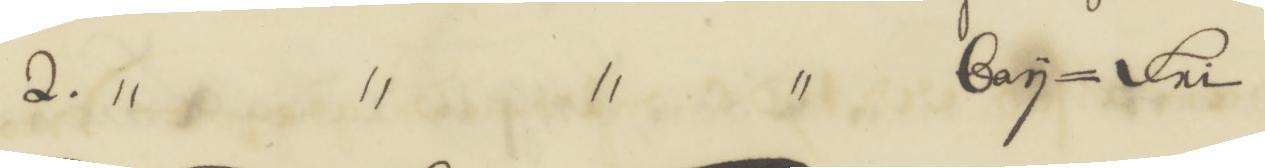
2. „ „ „ „ baij = Eri
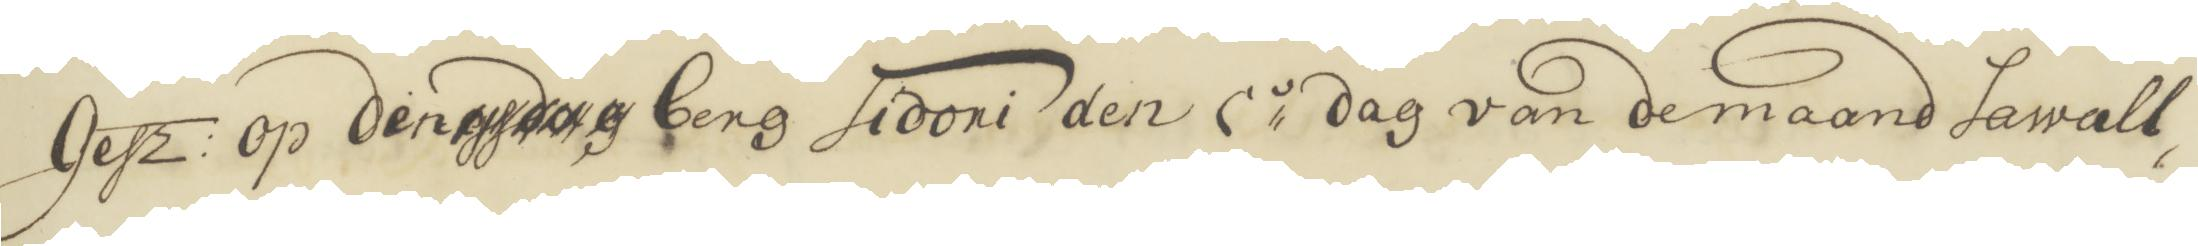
gesz: op den gjdag berg Tidori den 5„e dag van de maand Sawall,
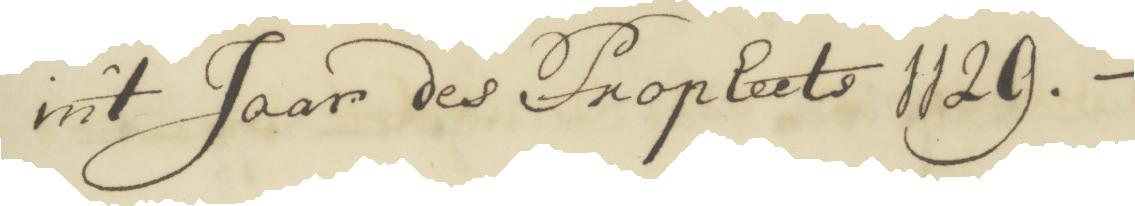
in ’t Jaar des Propheets 1129. —
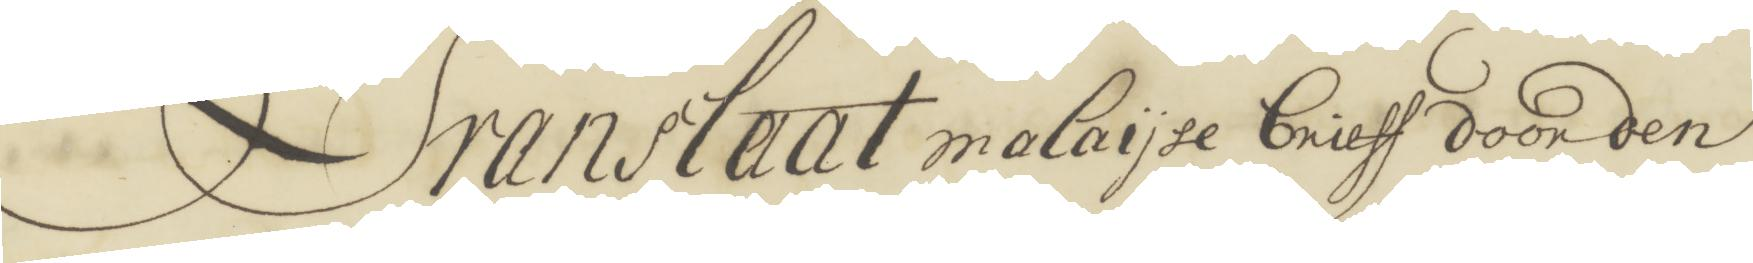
Translaat malaijse brieff door den
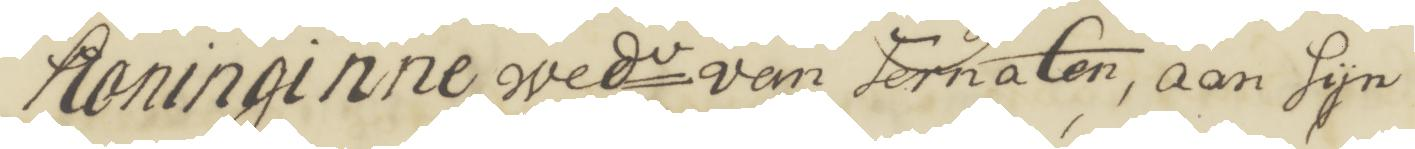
koninginne wed=e van Ternaten, aan Sijn
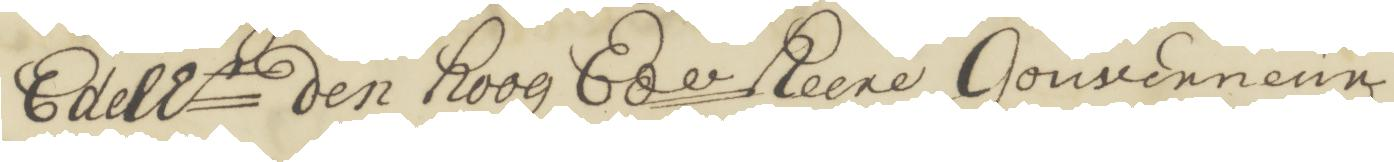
Edelh=t den hoog Ed=le Heere Gouverneur
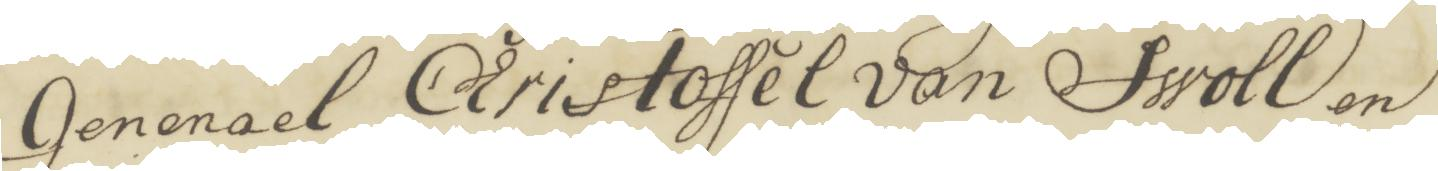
Genenael Christoffel van Swoll en
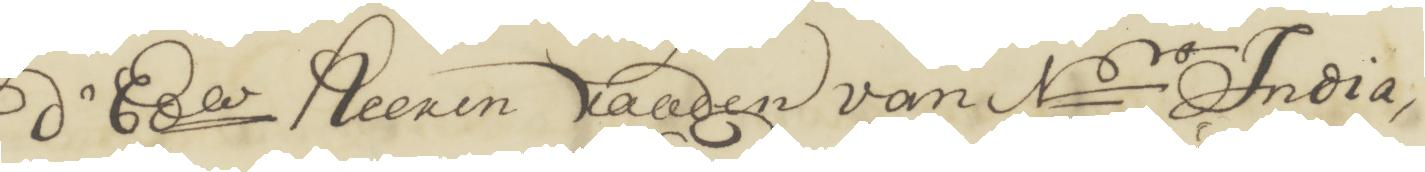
d’ Ed=le Heeren raaden van N=ts India,
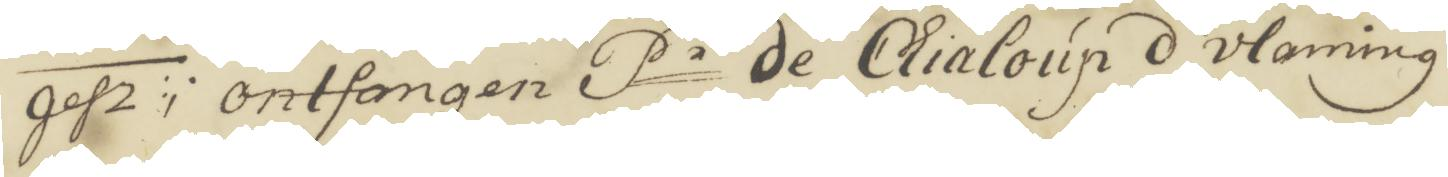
gesz: ontfangen P=r de Chialoup d’ vlaming
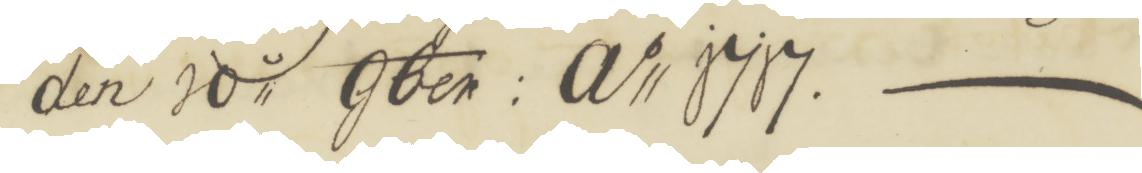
den 10„' 9ber: A„o 1717.
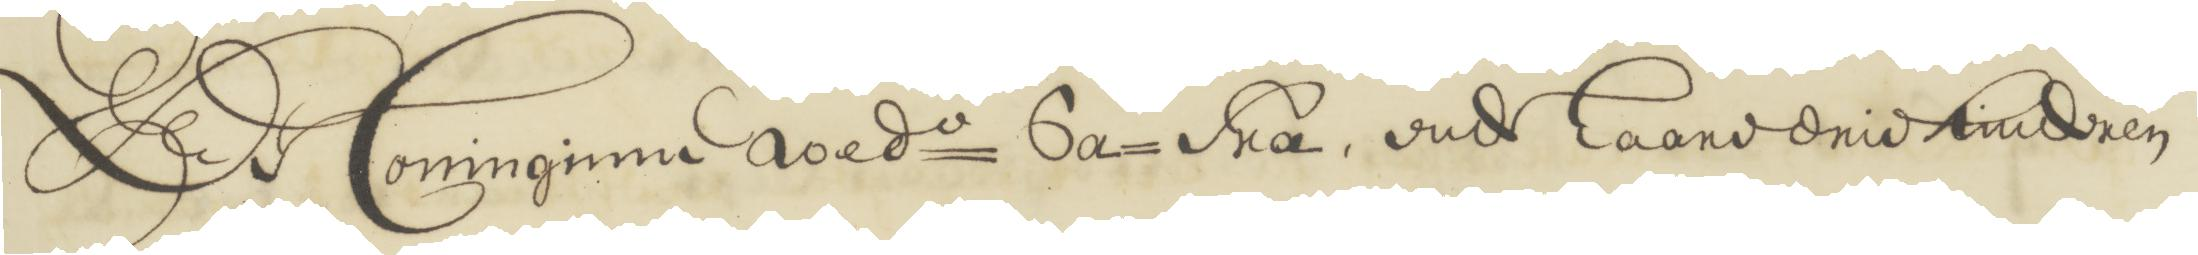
De Coninginne wed=e Sa= Era, ende haare drie kinderen
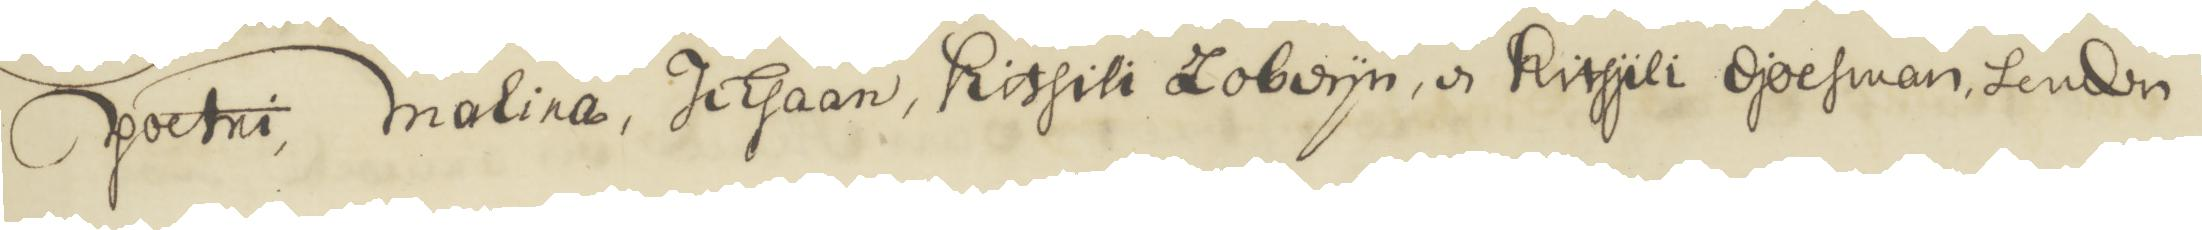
poetri, mahira, Ichsaan, kitsili Zobeijn, en kitssili djoesman, senden
